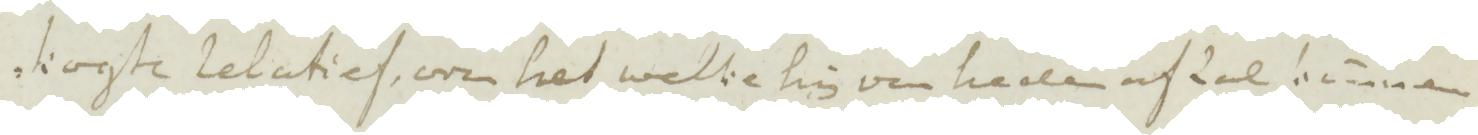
=kogte relatief, over het welke hij van heeden af zal kunnen
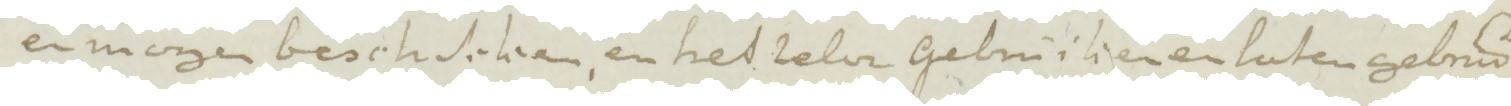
en mogen beschikken, en het zelve gebruiken, en laten gebrui
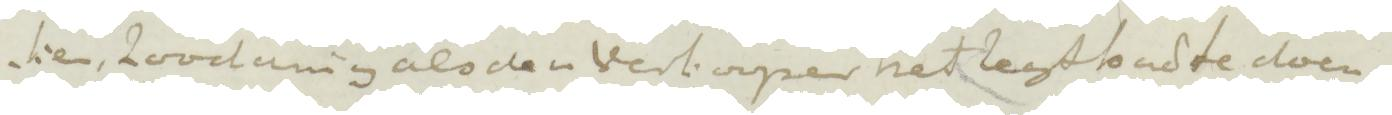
-ken, Zoodanig als den verkooper het regt had te doen.
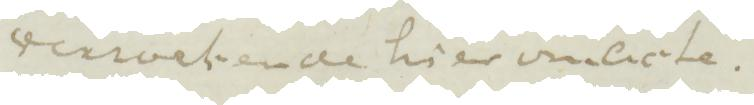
Verzoekende hier van acte.
